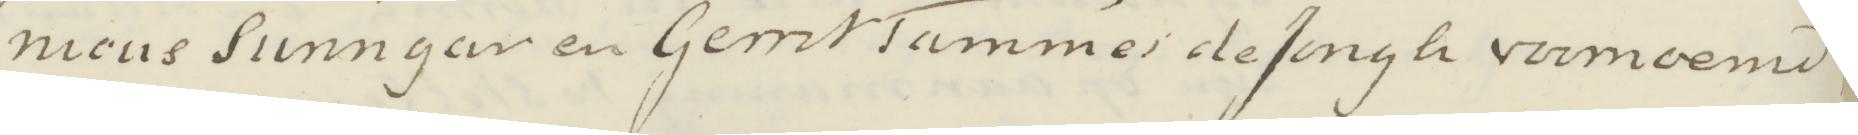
nicus Suringar en Gerrit Tammes de Jongh voornoemd
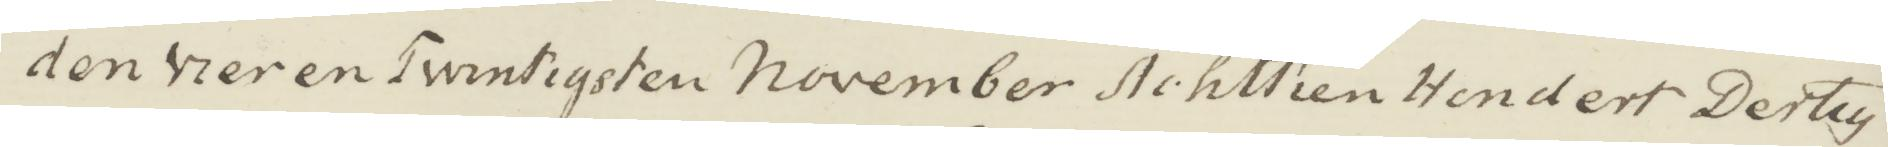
den vier en Twintigsten November Achttien Hondert Dertig
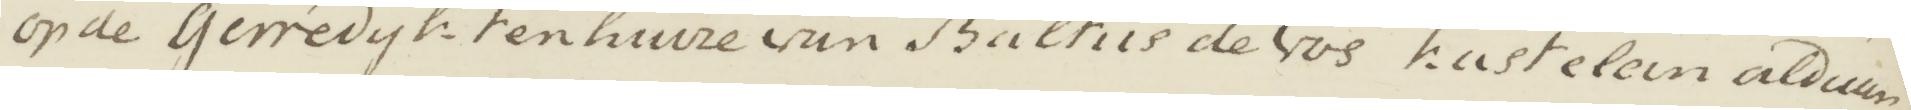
op de Gorredyk ten huize van Baltus de vos kastelan aldaar
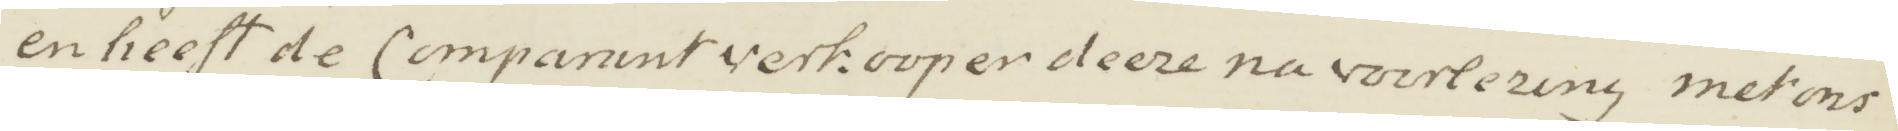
en heeft de Comparant verkooper deeze na voorlezing met ons
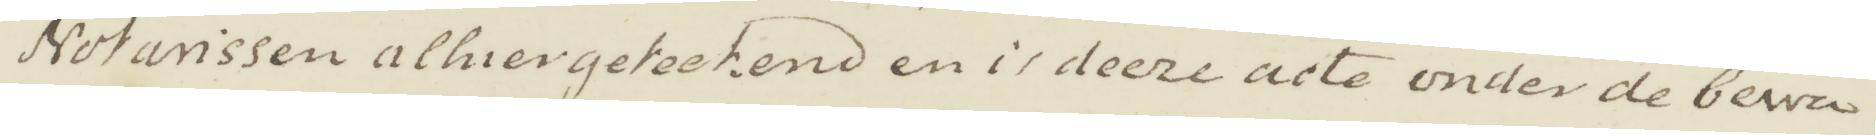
Notarissen alhier geteekend en is deeze acte onder de bewa
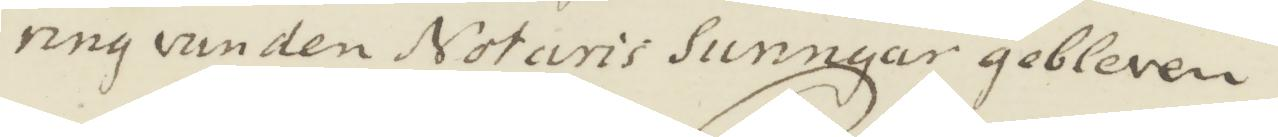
ring van den Notaris Suringar gebleven
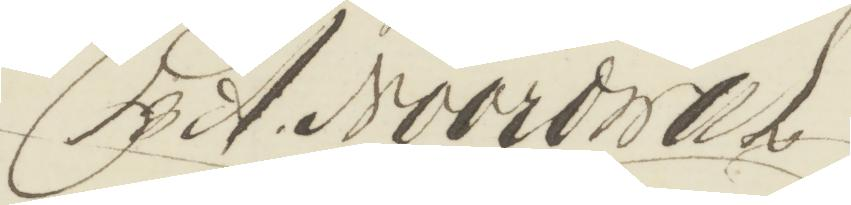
P A. Noordwal
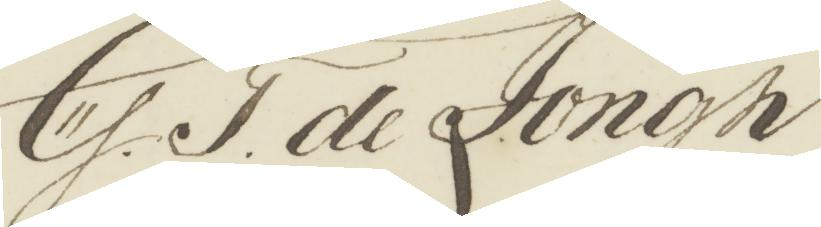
G.T. de Iongh
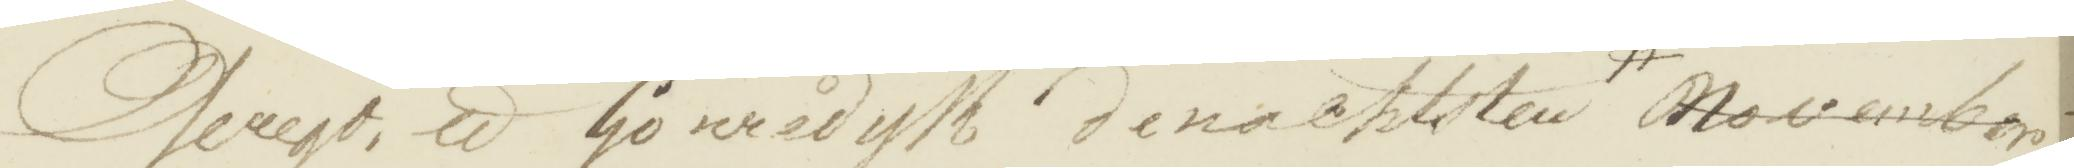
Geregt, te Gorredyk den achtsten ¶ November
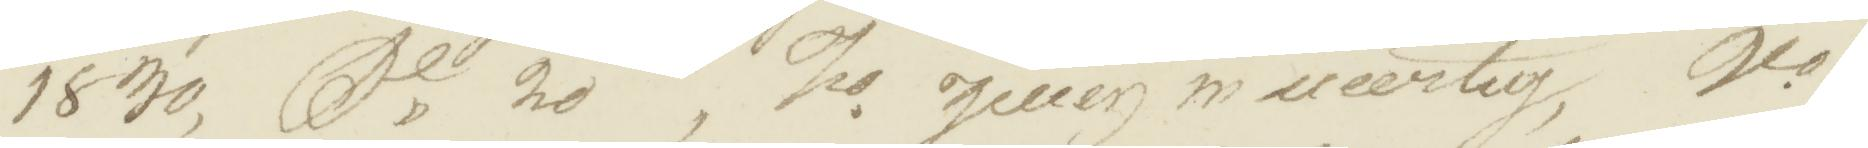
1830, D„l 20 , F.o zeven en veertig, V.o,
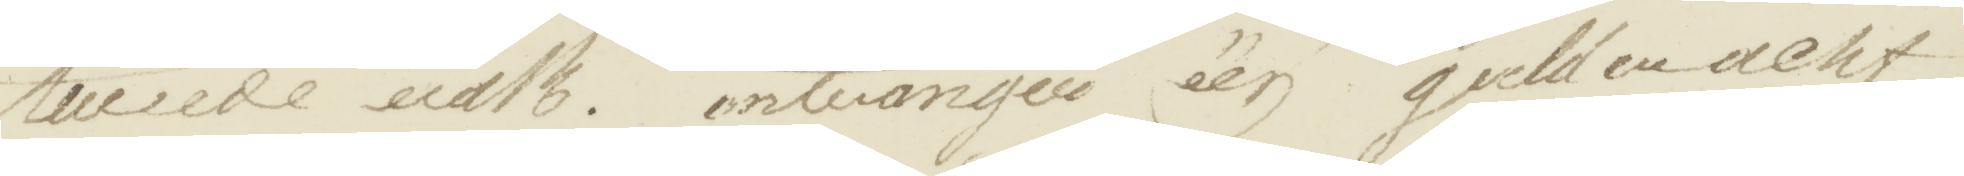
tweede vak. ontvangen één gulden acht
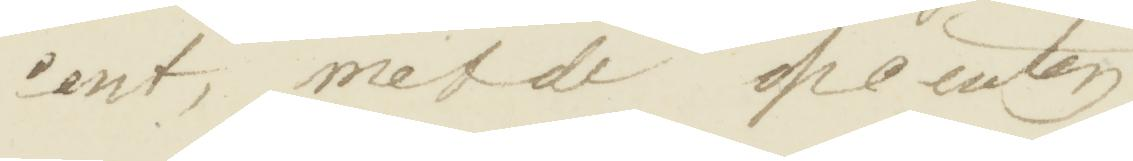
cent, met de opcenten.
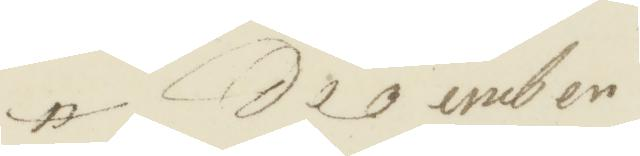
¶ december
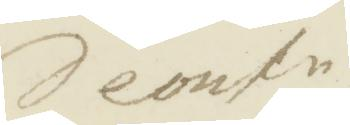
deontv.
